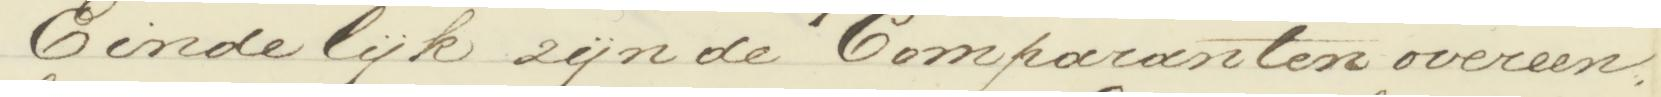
Eindelijk zijn de Comparanten overeen„
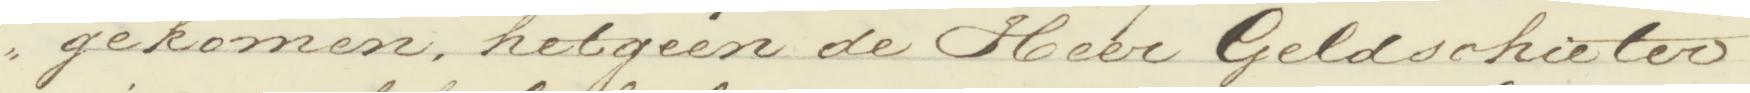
„ gekomen, hetgeen de Heer Geldschieter
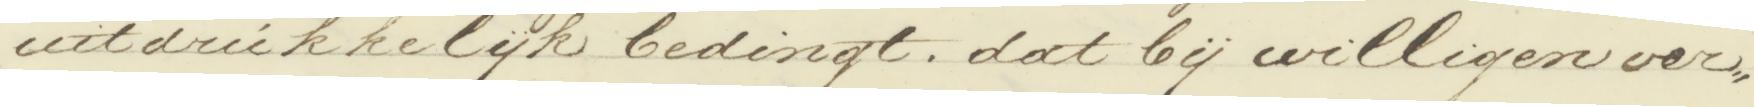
uitdrukkelijk bedingt, dat bij willigen ver„
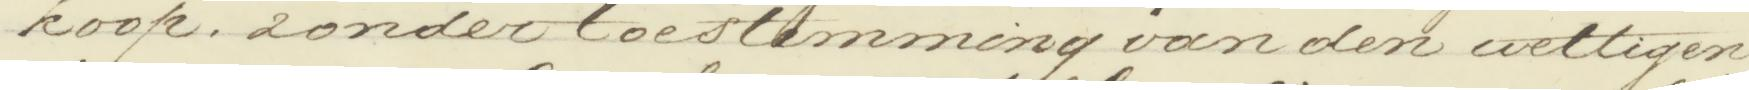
koop, zonder toestemming van den wettigen
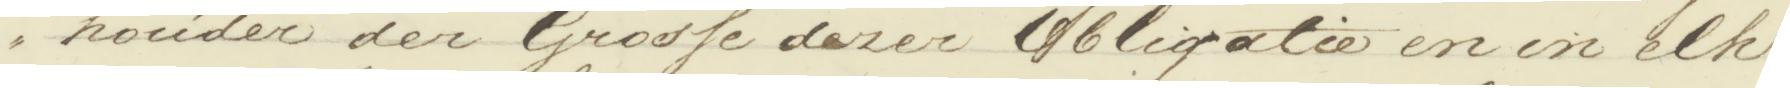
„ houder der Grosse dezer Obligatie en in elk
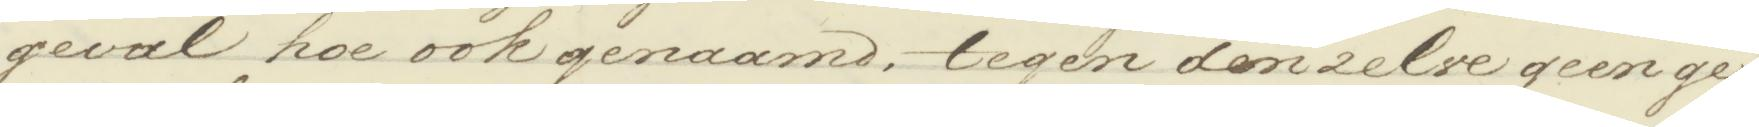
geval hoe ook genaamd, tegen den zelve geen ge„
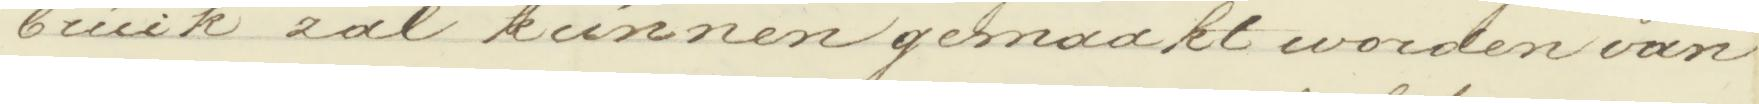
bruik zal kunnen gemaakt worden van
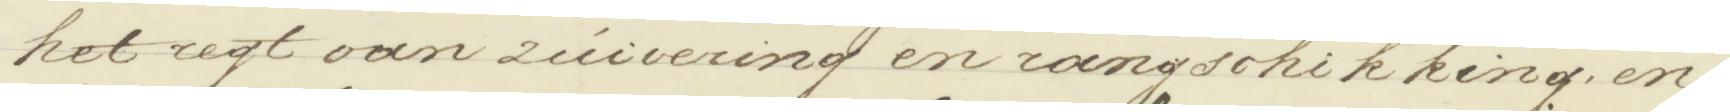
het regt van zuivering en rangschikking, en
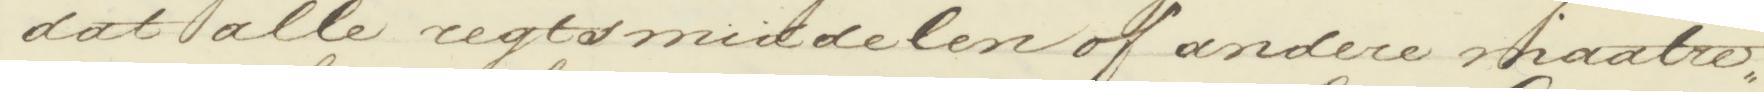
dat alle regtsmindelen of andere maatre„
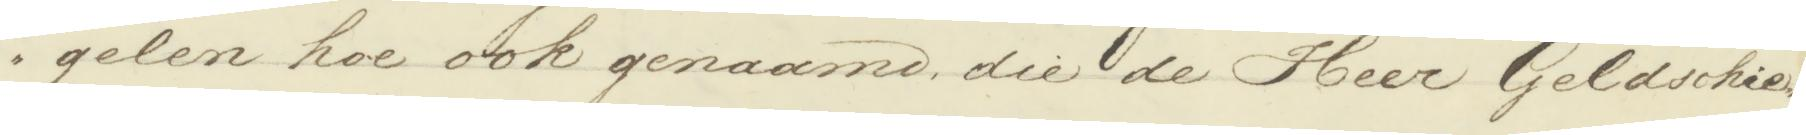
„gelen hoe ook genaamd, die de Heer Geldschie„
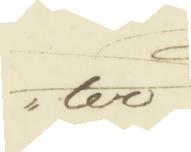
„ter
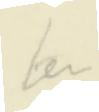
ten kantore
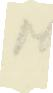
van my Notaris
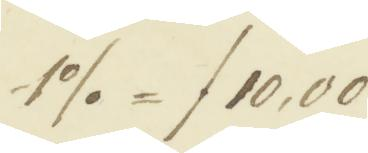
1%. = ƒ 10,00
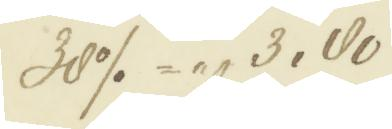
38% = „ 3.80
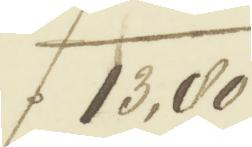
ƒ 13,80
